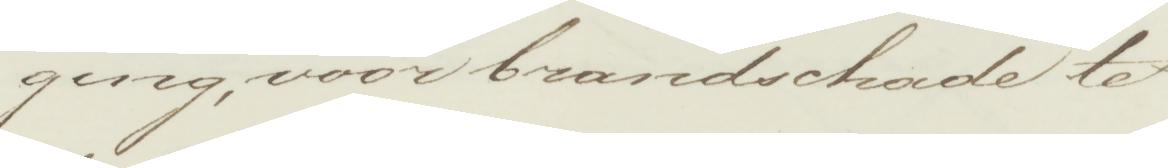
ging, voor brandschade te
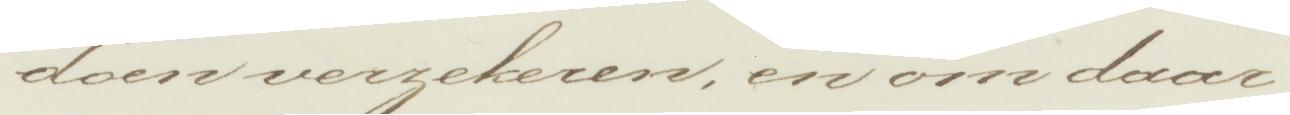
doen verzekeren, en om daar
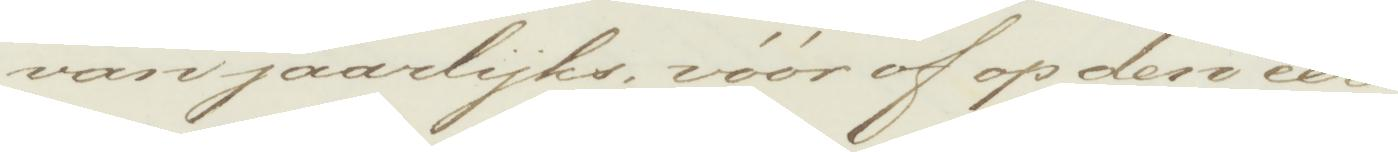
van jaarlijks, vóór of op den eer
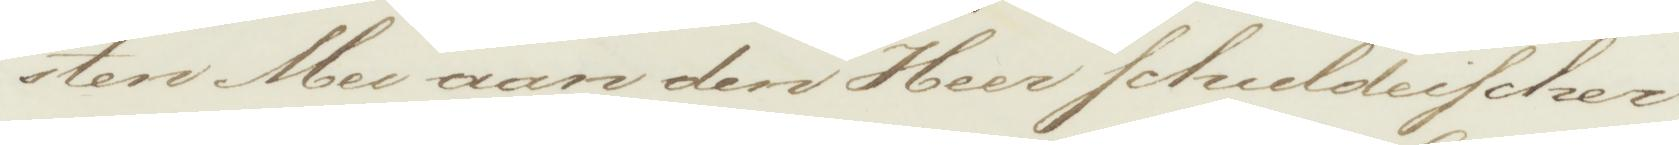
sten Mei aan den Heer schuldeischer
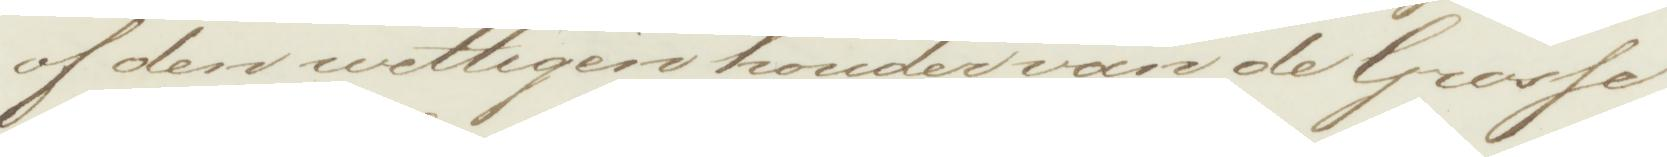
of den wettigen houder van de Grosse
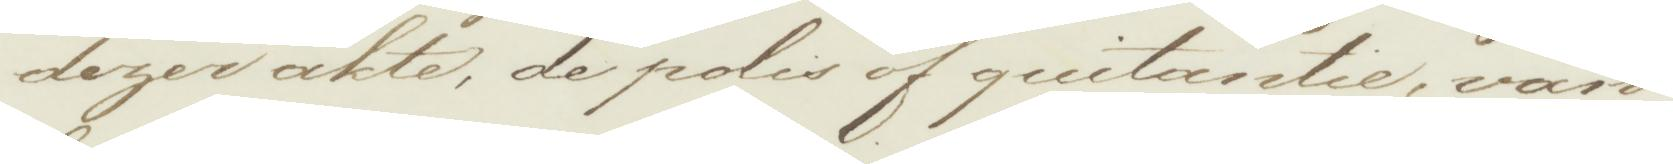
dezer akte, de polis of quitantie, van
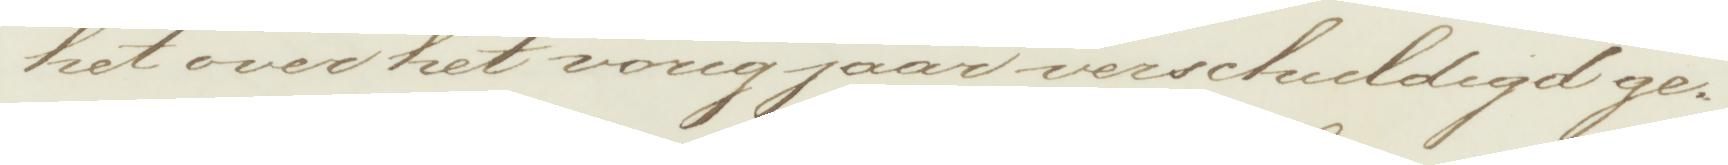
het over het vorig jaar verschuldigd ge„
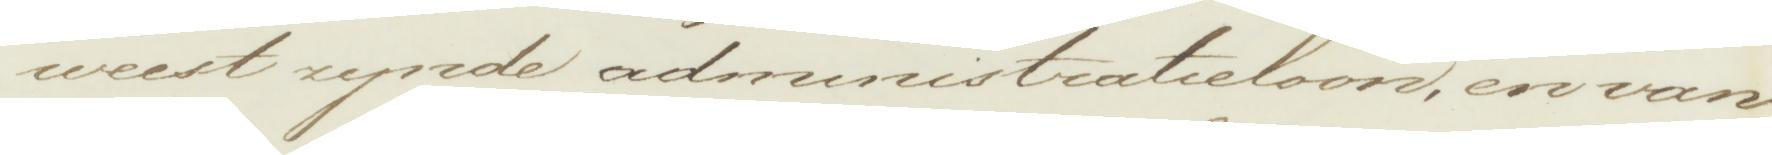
weest zynde administratieloon, en van
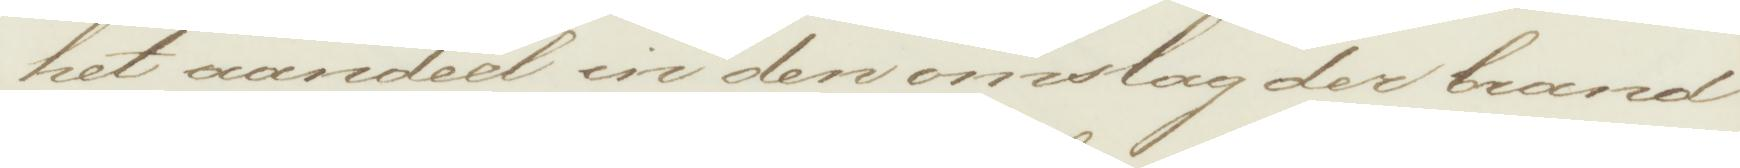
het aandeel in den omslag der brand
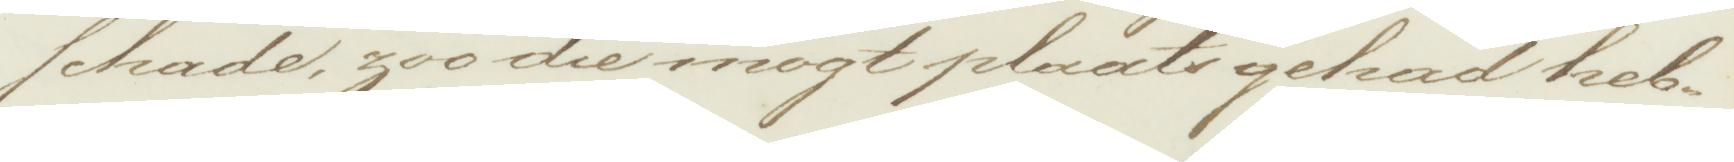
schade, zoo die mogt plaats gehad heb„
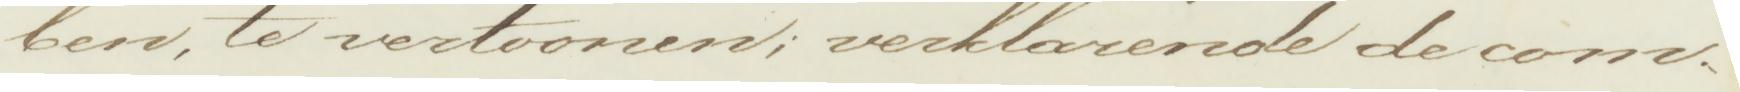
ben, te vertoonen; verklarende de com„
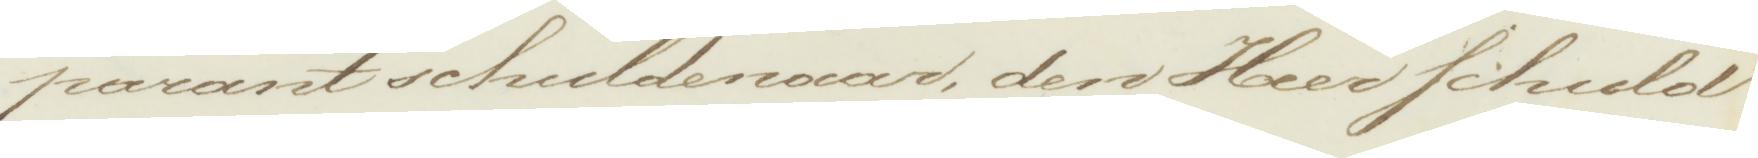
parant schuldenaar, den Heer schuld
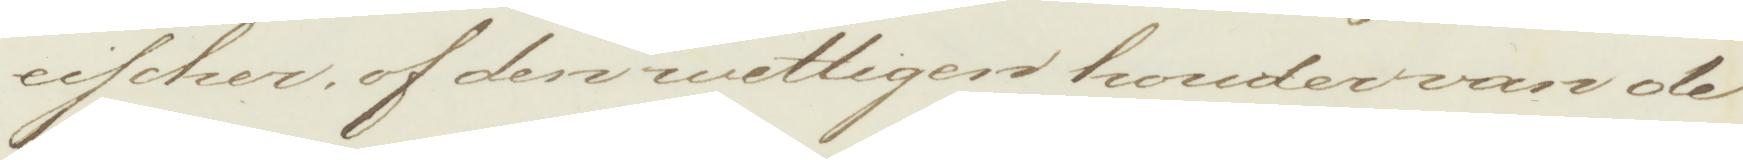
eischer, of den wettigen houder van de
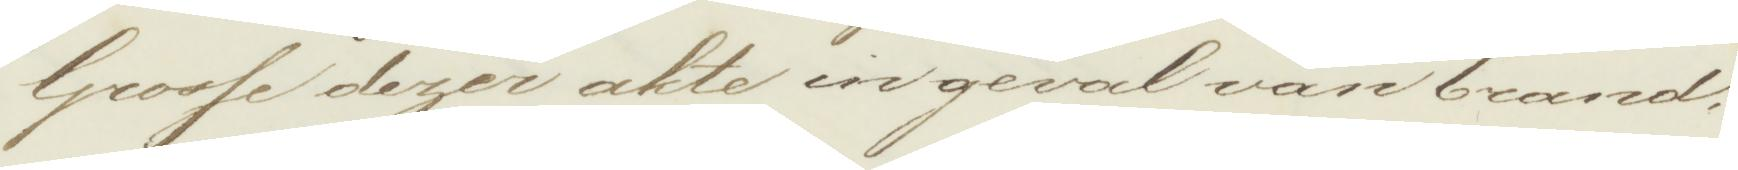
Grosse dezer akte ingeval van brand,
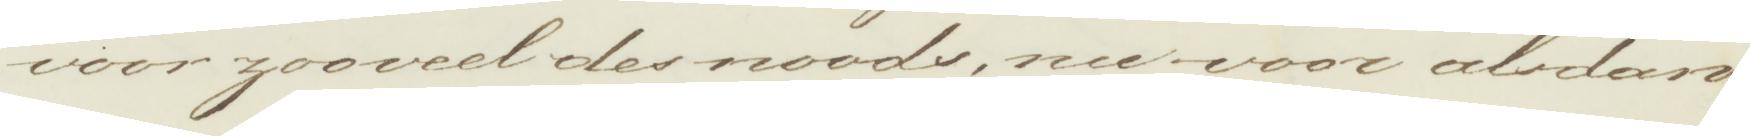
voor zooveel des noods, nu voor alsdan
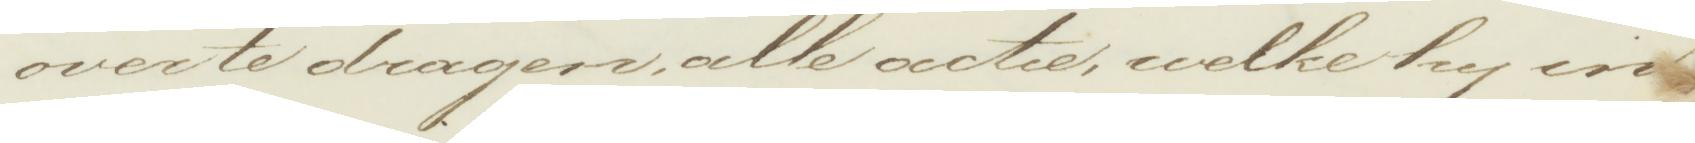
over te dragen, alle actie, welke hy in
